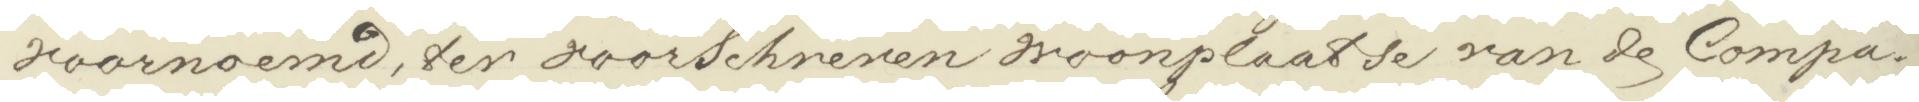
voornoemd, ter voorschreven woonplaatse van de Compa„
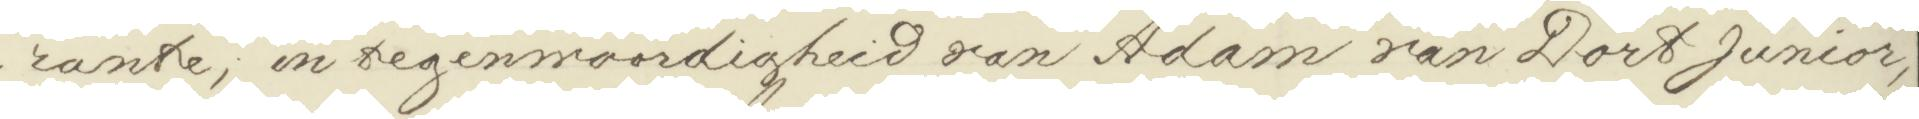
rante; in tegenwoordigheid van Adam van Dort Junior,
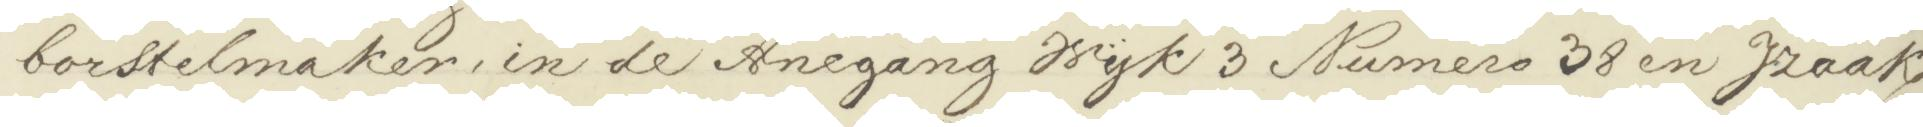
borstelmaker, in de Anegang wijk 3 Numero 38 en Jzaak
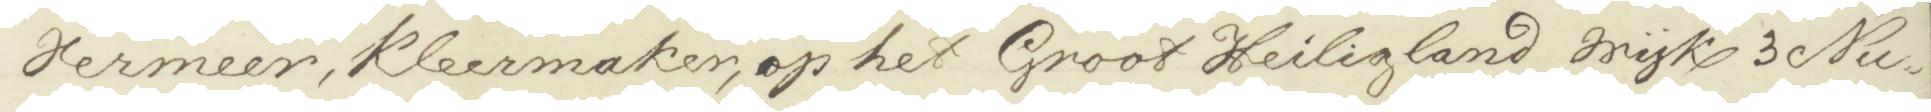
Vermeer, Kleermaker, op het Groot Heiligland wijk 3 Nu„
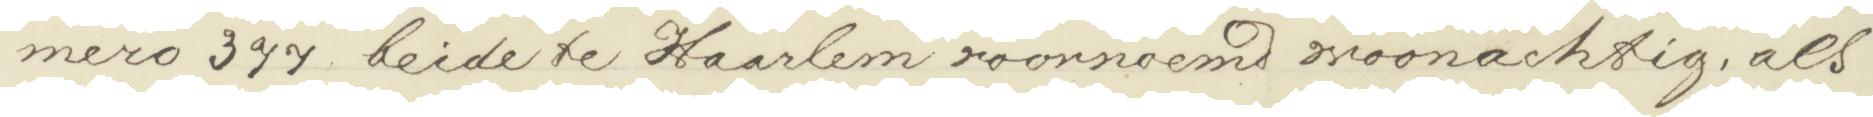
mero 377 beide te Haarlem voornoemd woonachtig, als
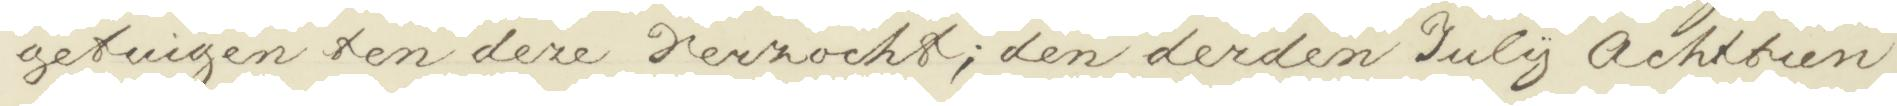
getuigen ten deze verzocht; den derden Iulij Achttien
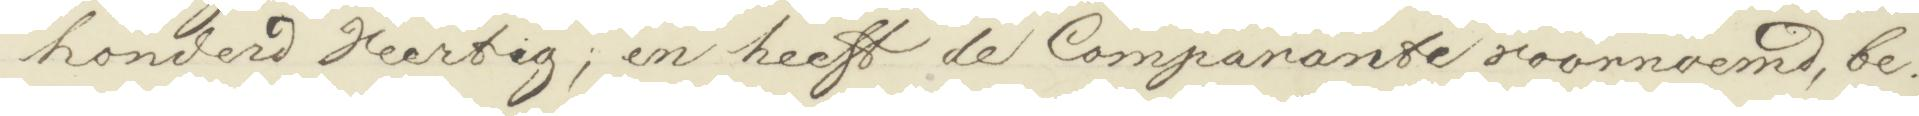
honderd Veertig; en heeft de Comparante voornoemd, be
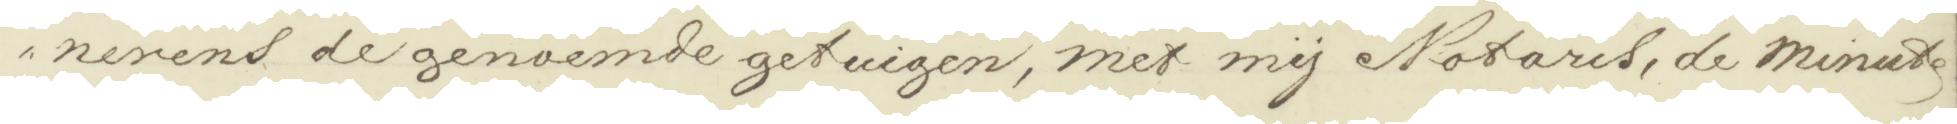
„nevens de genoemde getuigen, met mij Notaris, de minute
